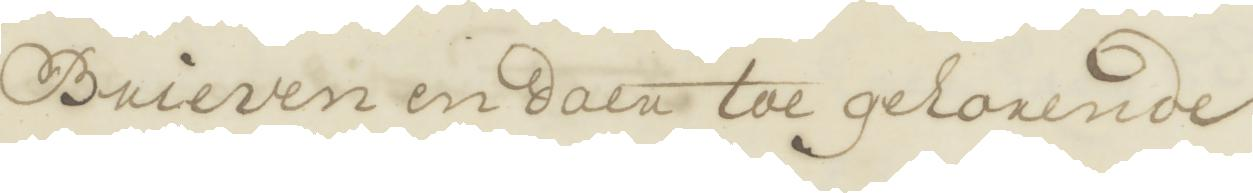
Brieven en daer toe gehorende
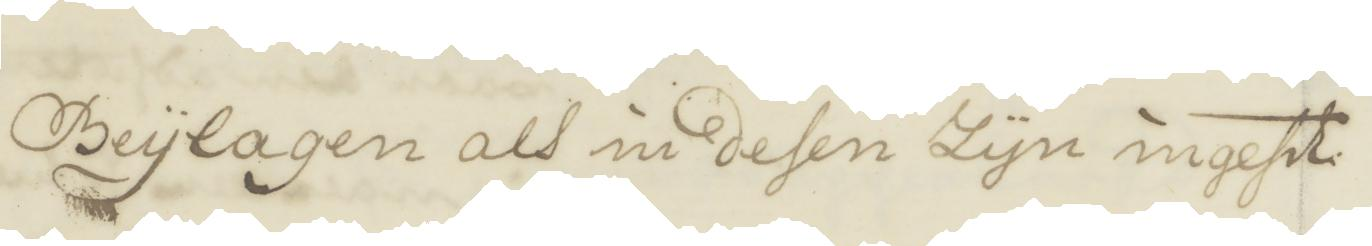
Beijlagen als in desen zijn ingesch:
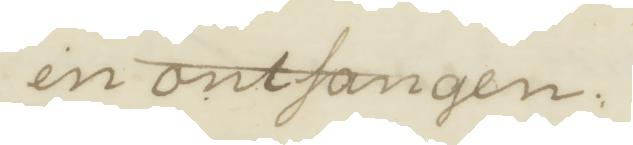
en ontfangen:
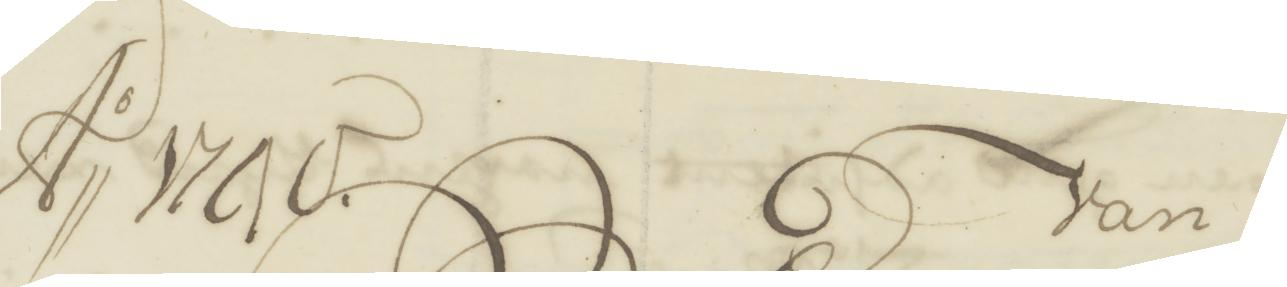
A„o 1740. Van
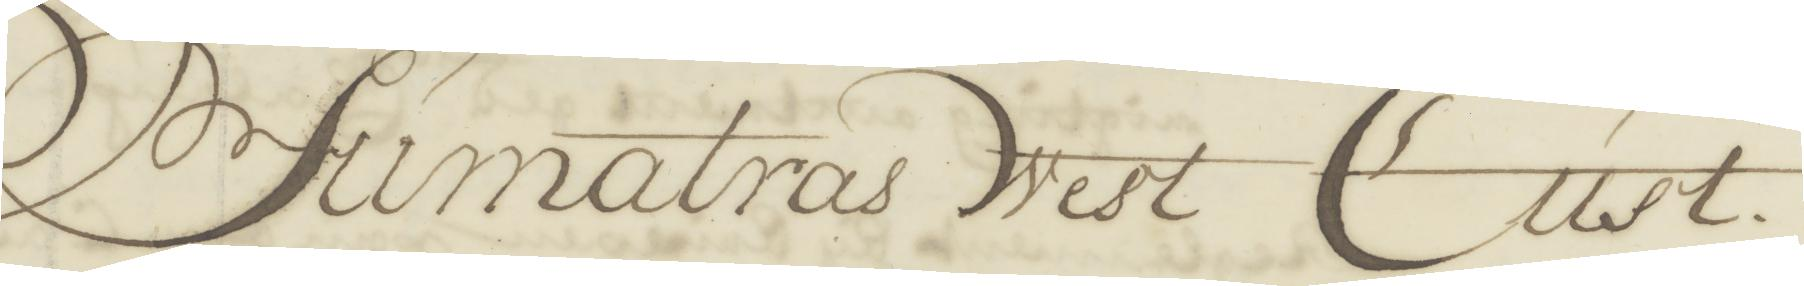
Sumatras West Cust.
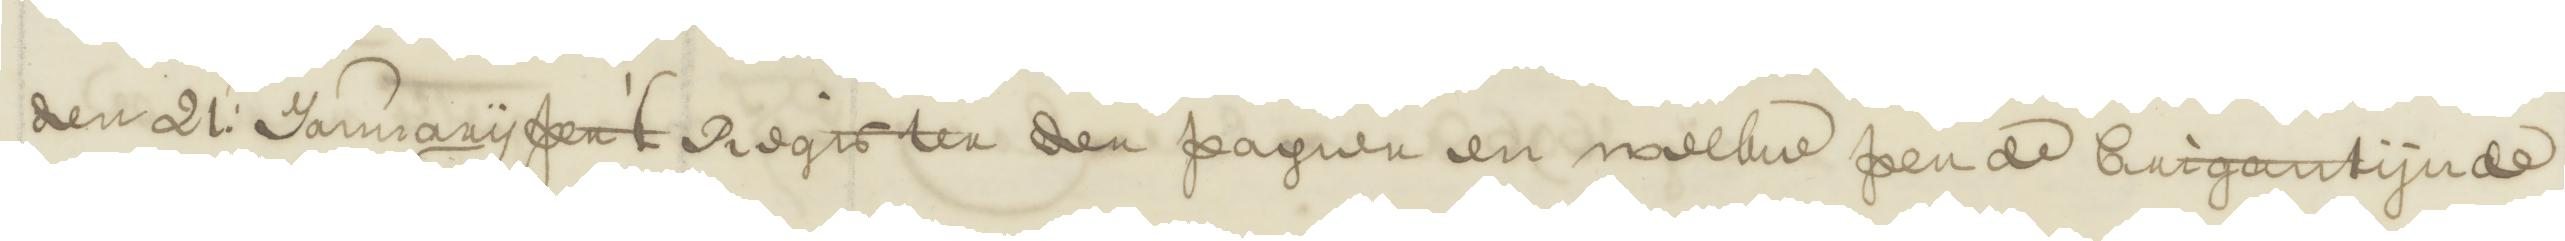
den 21:' Januarij per 't Register der papier en welke per de brigantijn de
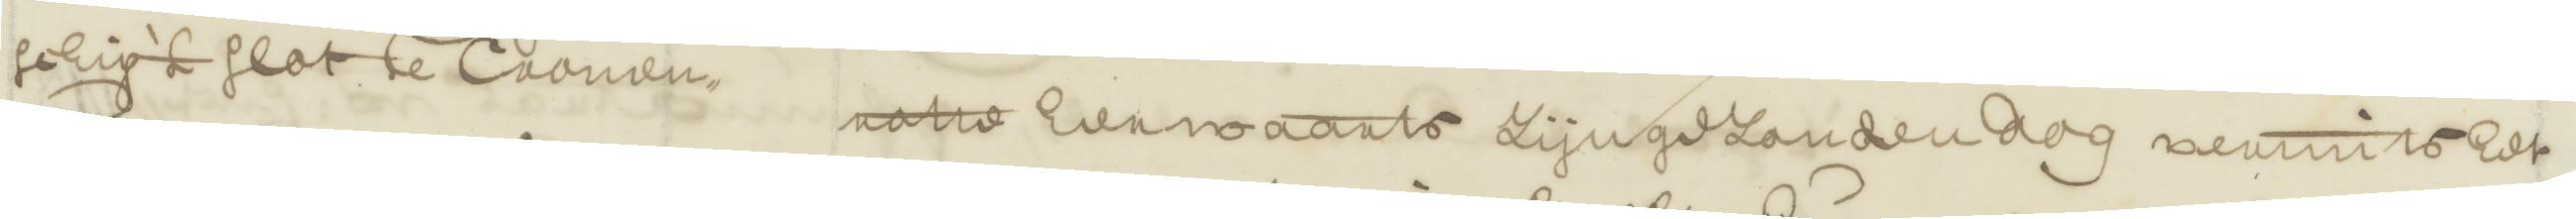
schip 't slot te Cronen„ rotte herwaarts zijn gezonden dog vermits het
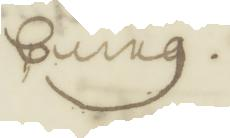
burg.—.
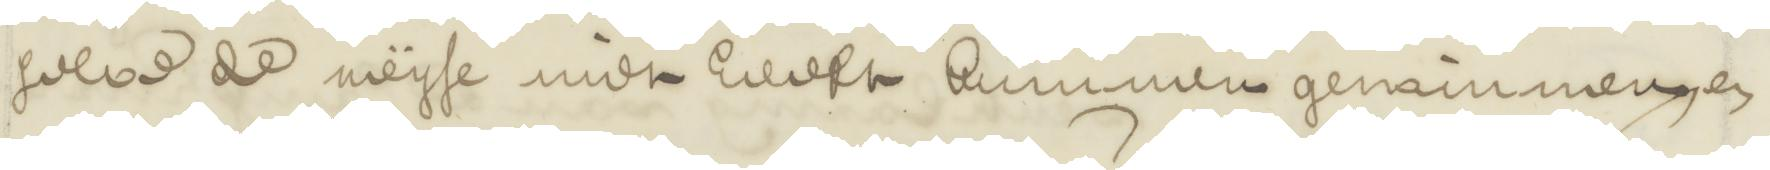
selve de reijse niet heeft kunnen gewinnen, en
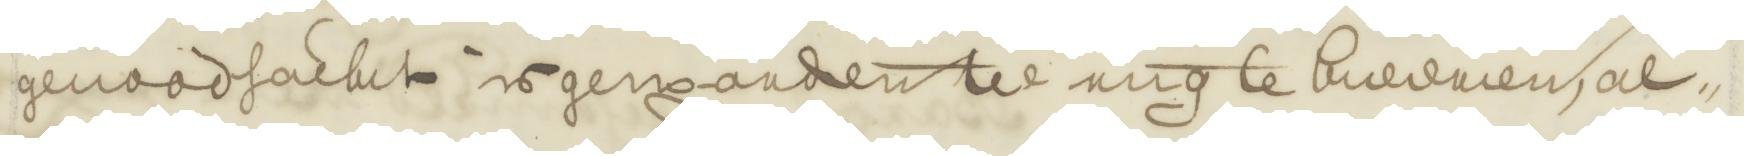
genoodsaekt is geworden te rug te keeren, al„
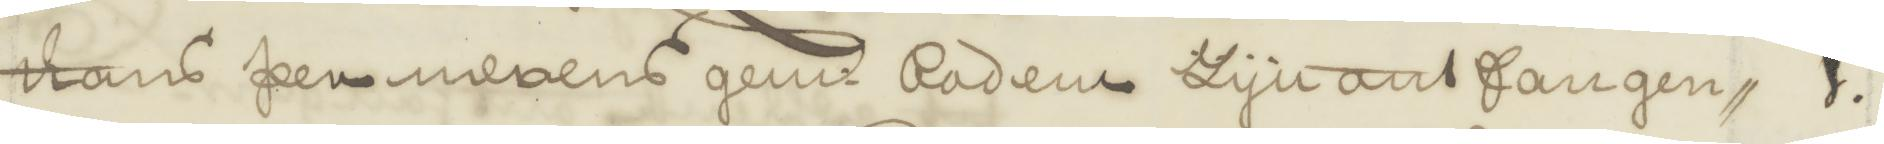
thans per nevens gem: Raden zijn ontfangen„ 1.
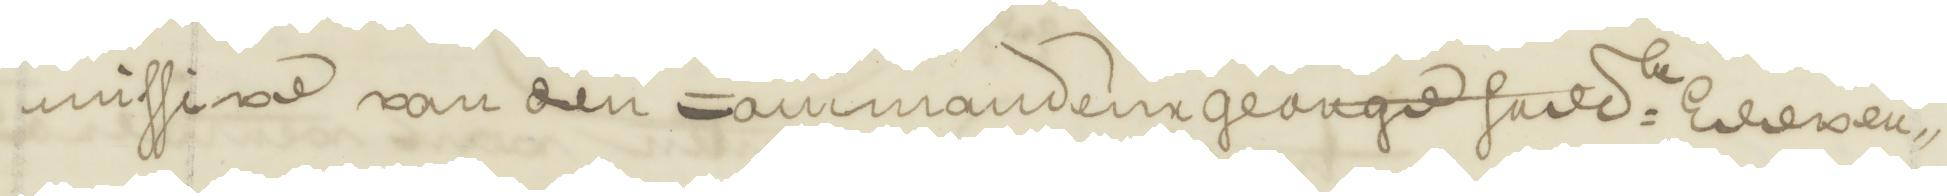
missive van den commandeur george fred=k heever„
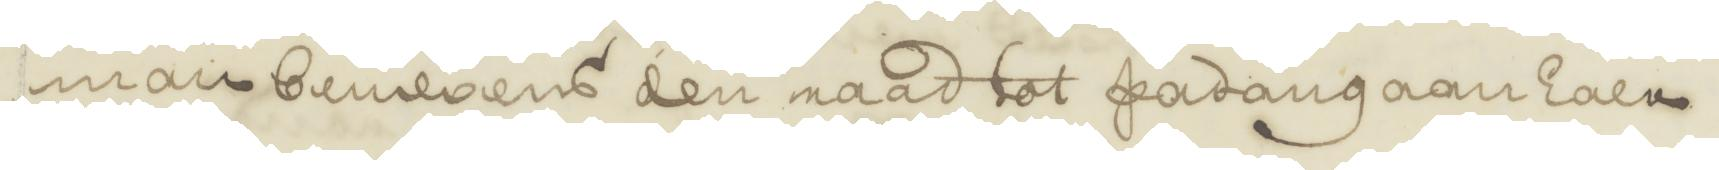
man benevens den raad tot padang aan haer
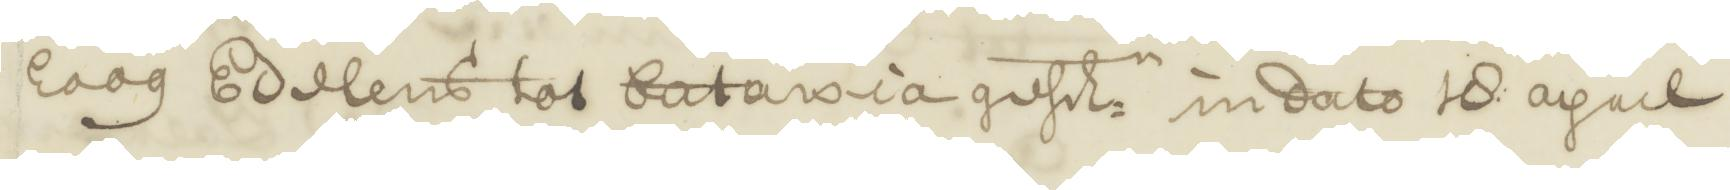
hoog Edelens tot batavia gesch=n in dato 18: april
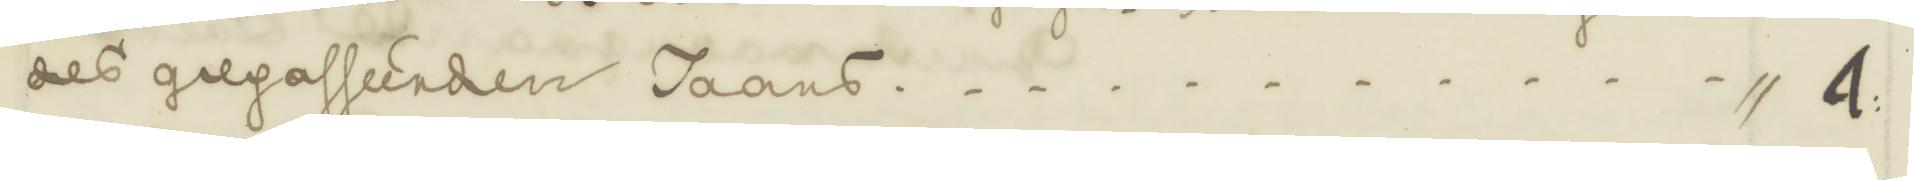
des gepasseerden Iaars . . . . . . . . . . . „ 4:
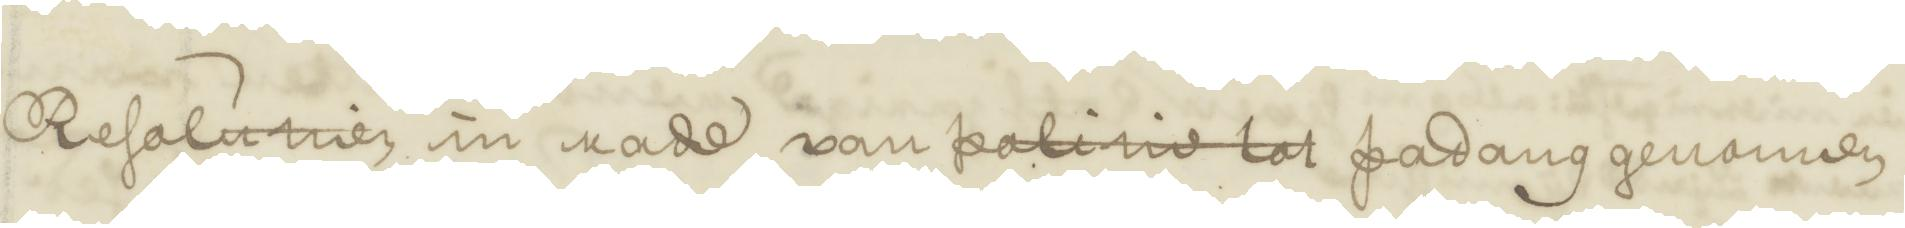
Resolutien in rade van politie tot padang genomen
